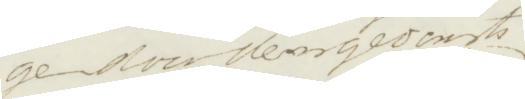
gen door den gedonrt
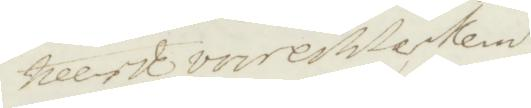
keerde voor echterkend
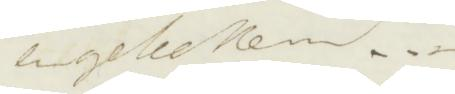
engeteekend . . .
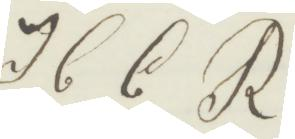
J C C R
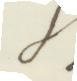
W g M
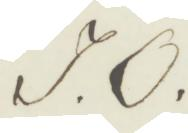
J:O.
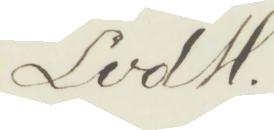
LvdH
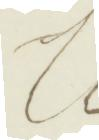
CGJr
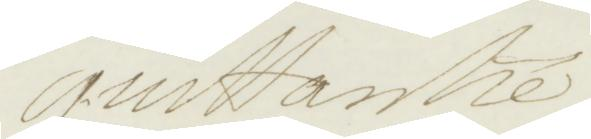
quittantie
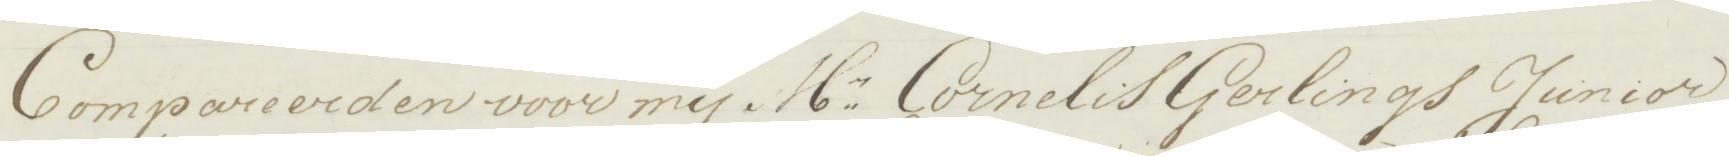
Compareerden voor mij M„r Cornelis Gerlings Junior
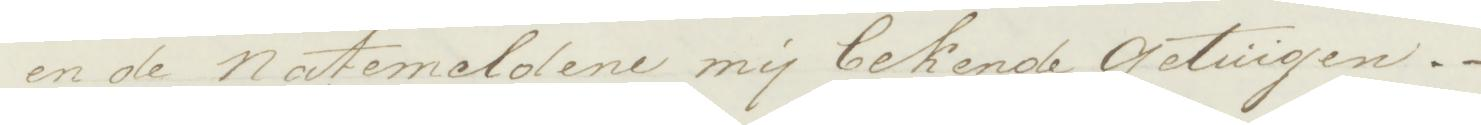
en de Natemeldene mij bekende Getuigen.
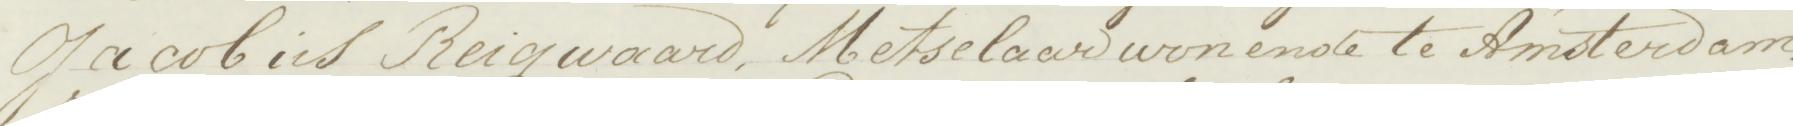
Jacobus Reigwaard, Metselaar wonende te Amsterdam,
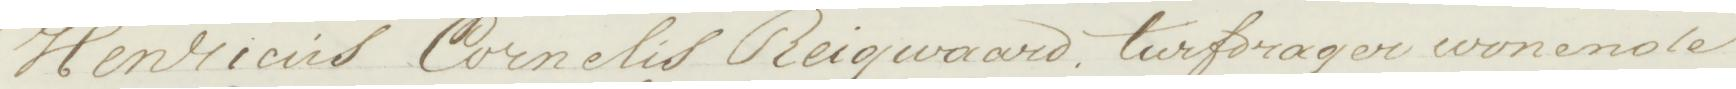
Henricus Cornelis Reigwaard, tuifdrager wonende
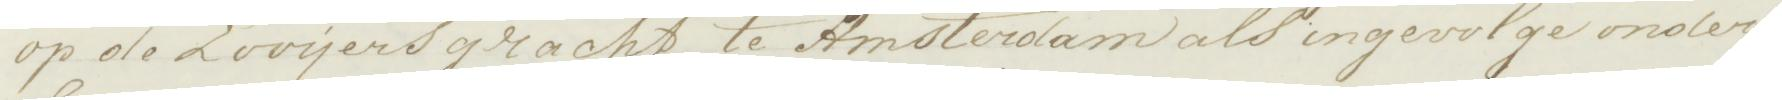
op de Looijersgracht te Amsterdam als ingevolge onder
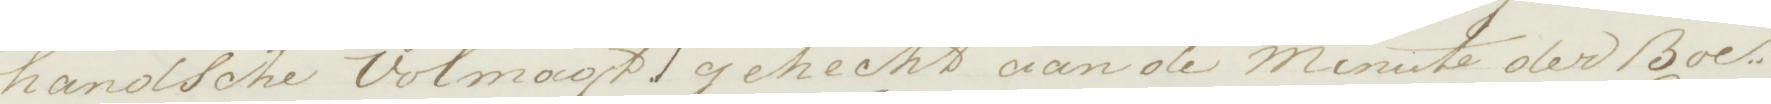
handsche volmagt ¶ gehecht aan de Minute der Boe„
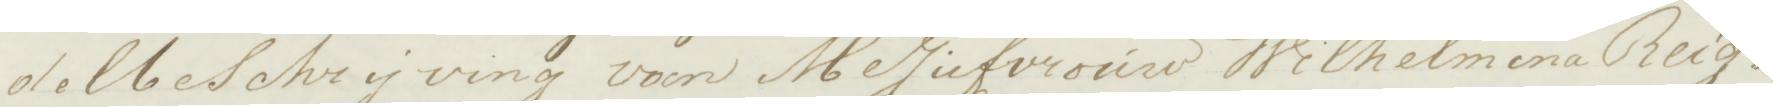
delbeschrijving van Mejufvrouw Wilhelmina Reig„
